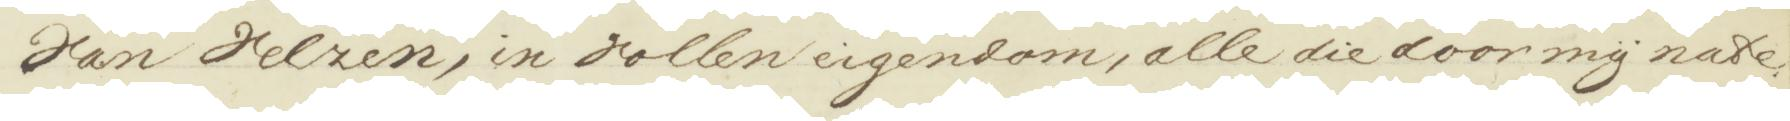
van Velzen, in vollen eigendom, alle die door mij nate
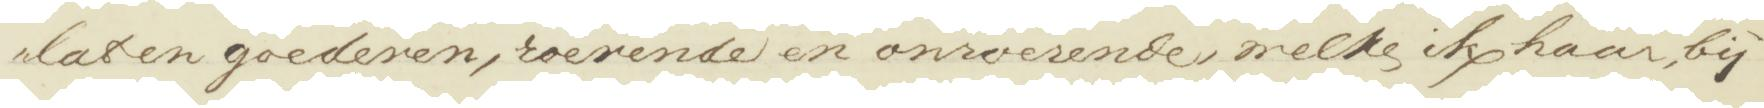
laten goederen, roerende en onroerende, welke ik haar, bij
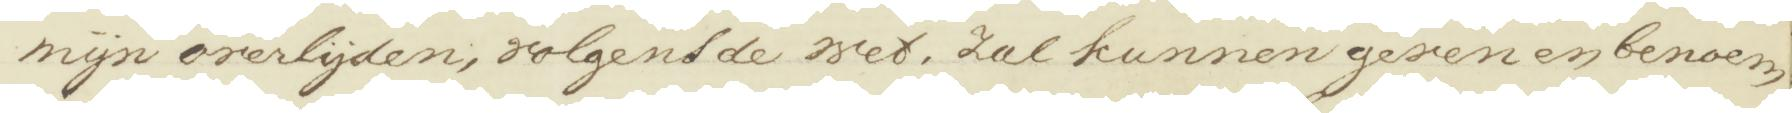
mijn overlijden, volgens de wet, zal kunnen geven en benoem
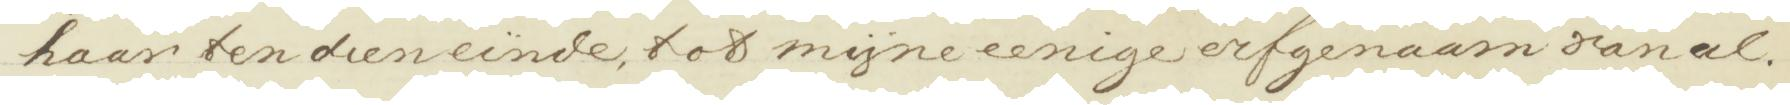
haar ten dien einde, tot mijne eenige erfgenaam van al.
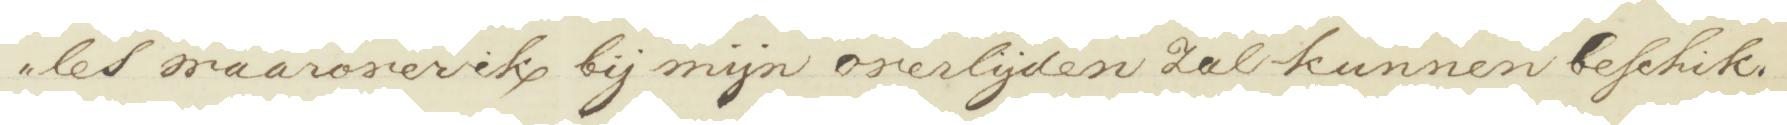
„les waarover ik bij mijn overlijden zal kunnen beschik.
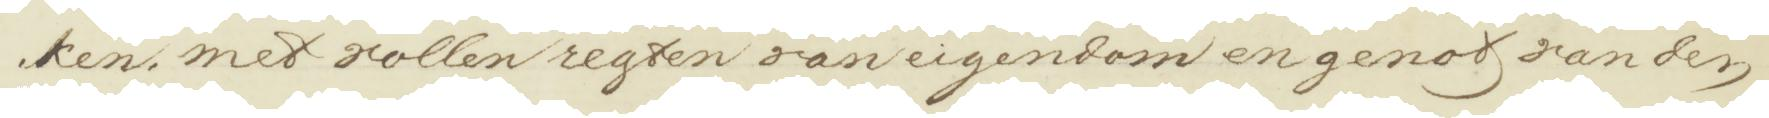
.ken, met vollen regten van eigendom en genot van den
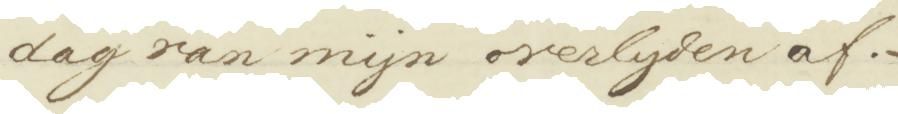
dag van mijn overlijden af.
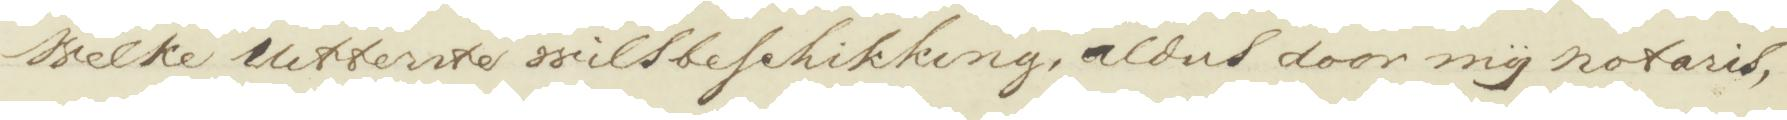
Welke Uitterste wils beschikking, aldus door mij notaris,
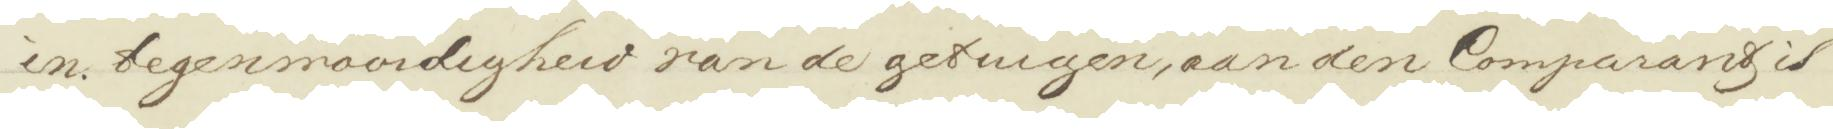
in tegenwoordigheid van de getuigen, aan den Comparant is
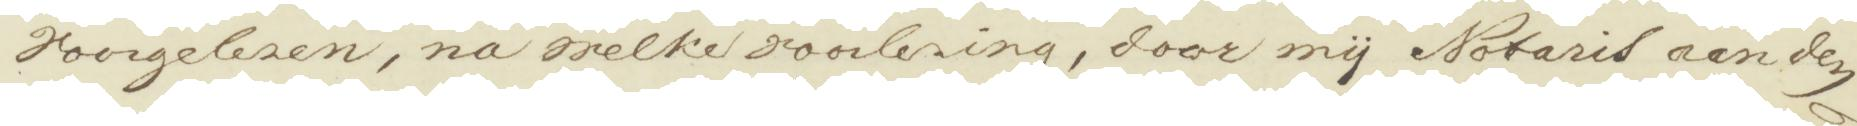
voorgelezen, na welke voorlezing, door mij Notaris aan den
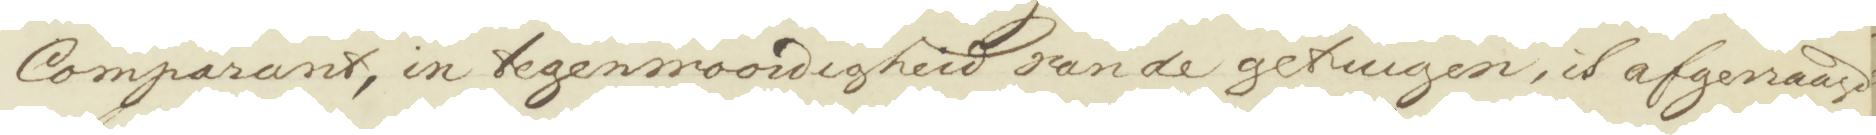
Comparant, in tegenwoordigheid van de getuigen, is afgevraagd
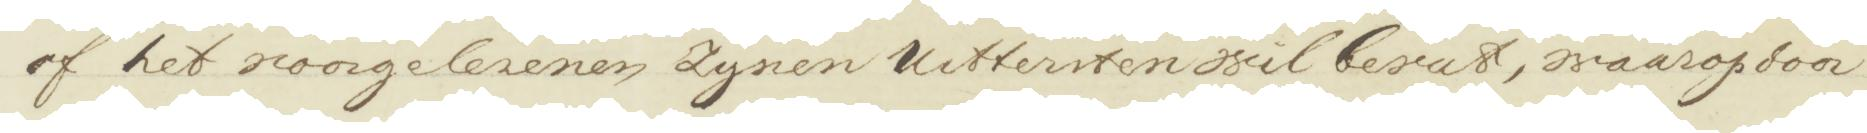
of het voorgelezenen zynen uittersten wil bevat, waarop door
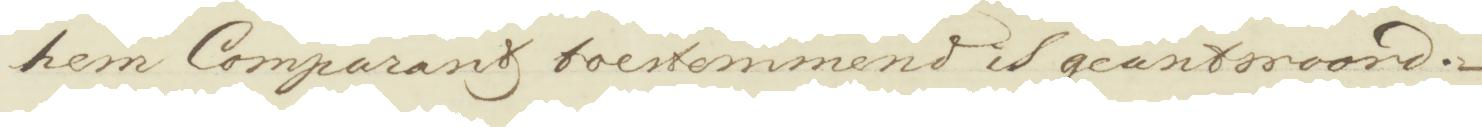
hem Comparant toestemmend is geantwoord.
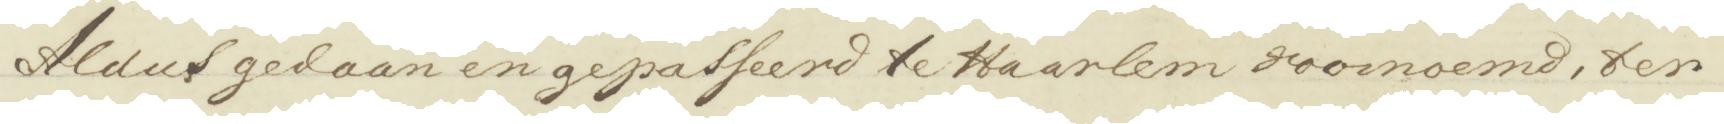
Aldus gedaan en gepasseerd te Haarlem voornoemd, ter
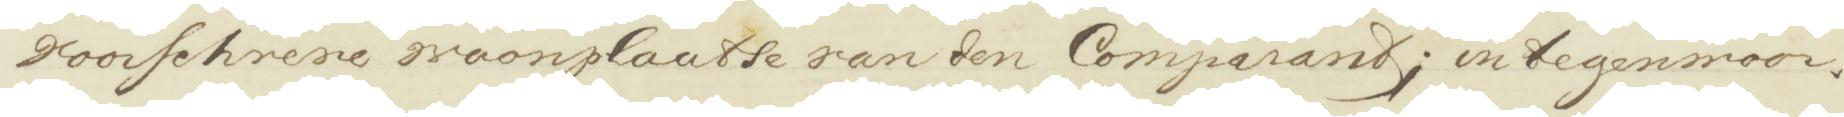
voorschreve woonplaatse van den Comparant; in tegenwoor
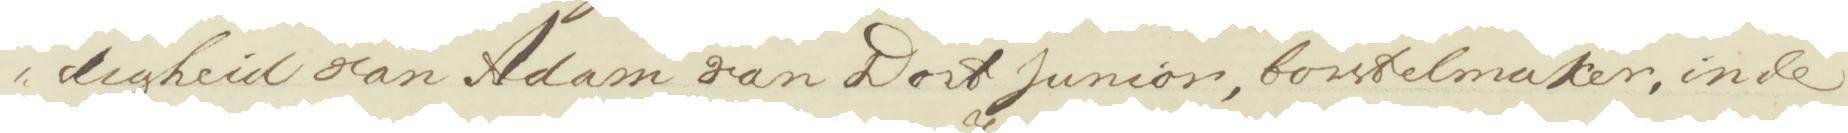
„digheid van Adam van Dort Junior, borstelmaker, in de
